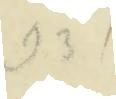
J3
